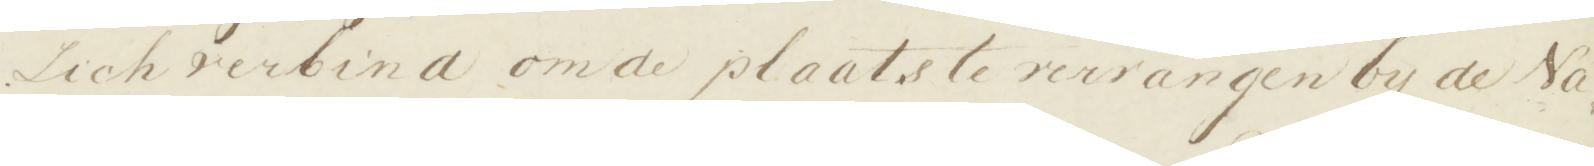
zich verbind om de plaats te vervangen by de Na
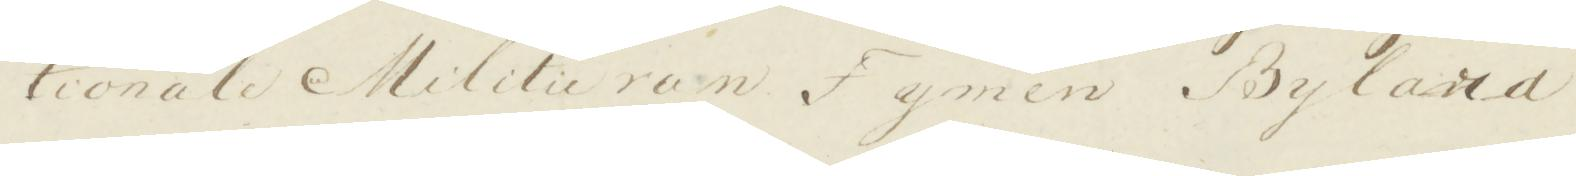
tionale Militie van Tymen Bylard
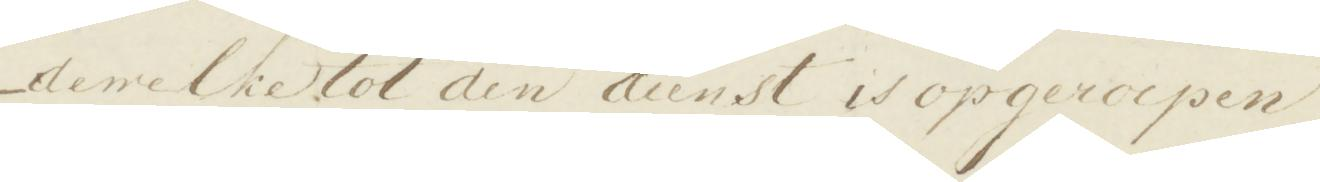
dewelke tot den dienst is opgeroepen
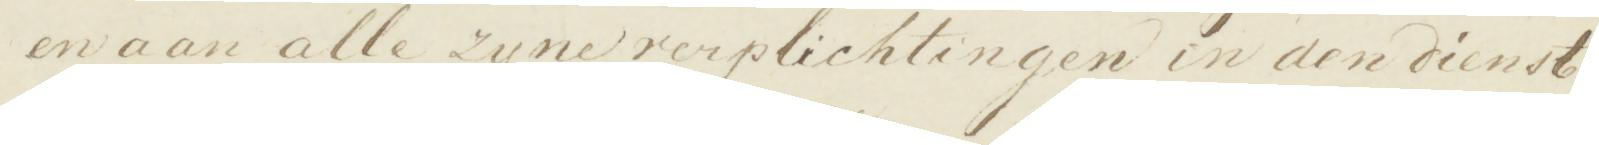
en aan alle zyne verplichtingen in den dienst
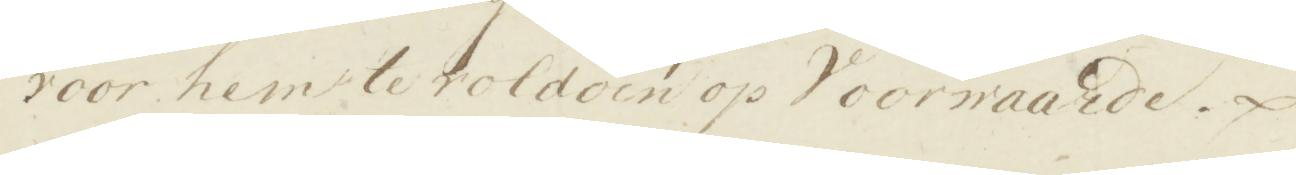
voor hem te voldoen op Voorwaarde.
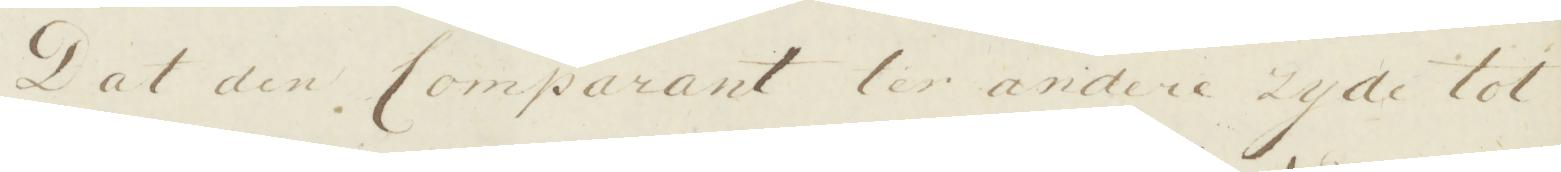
Dat den Comparant ter andere zyde tot
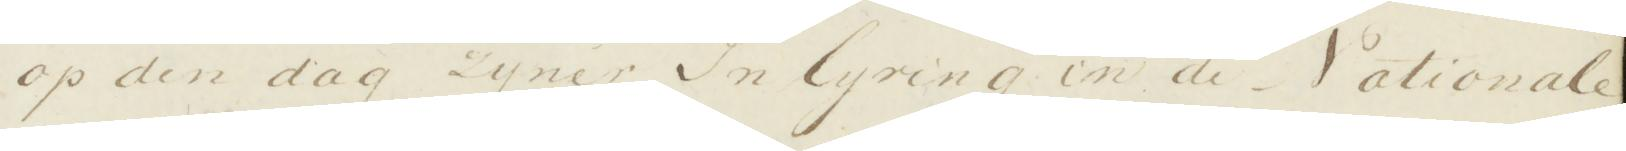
op den dag zyner Inlyving in de Nationale
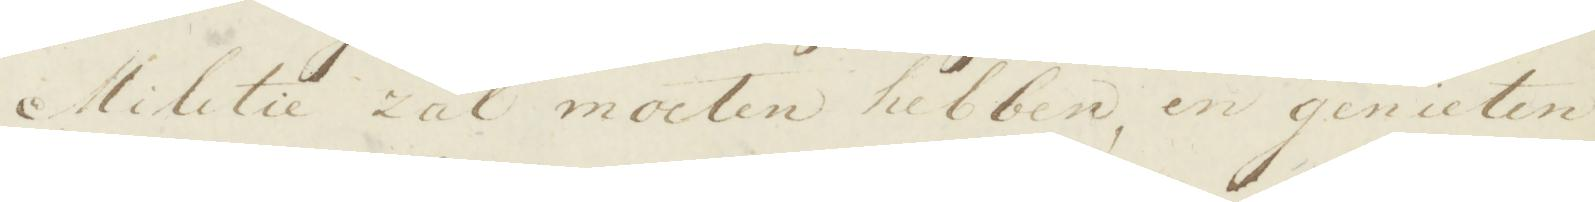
Militie zal moeten hebben, en genieten
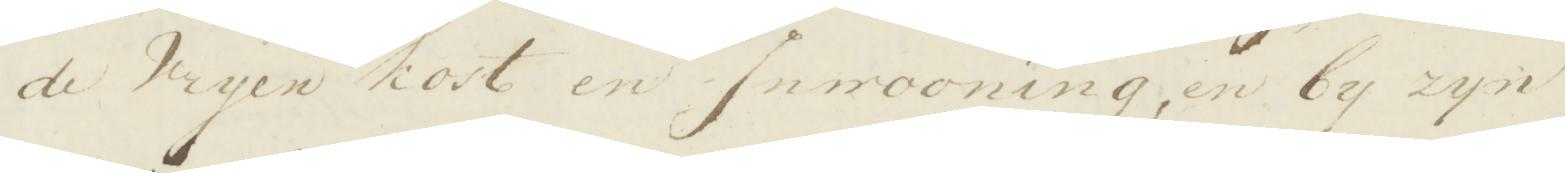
de vryen kost en Jnwooning, en by zyn
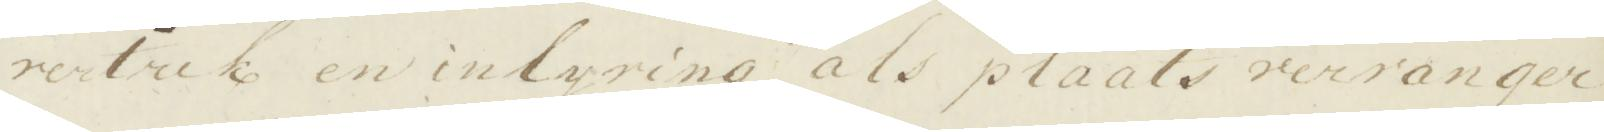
vertrek en inlyving als plaats vervanger
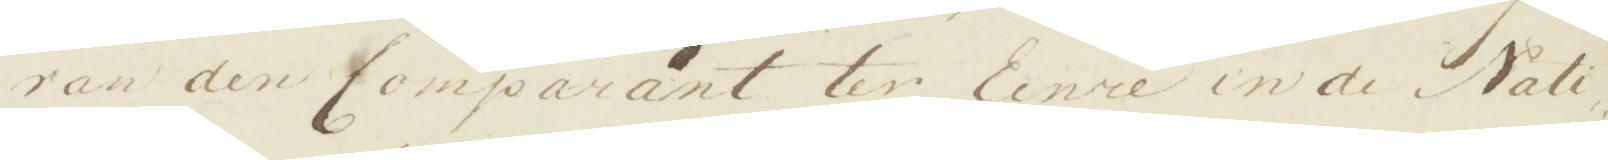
van den Comparant ter Eenre in de Nati„
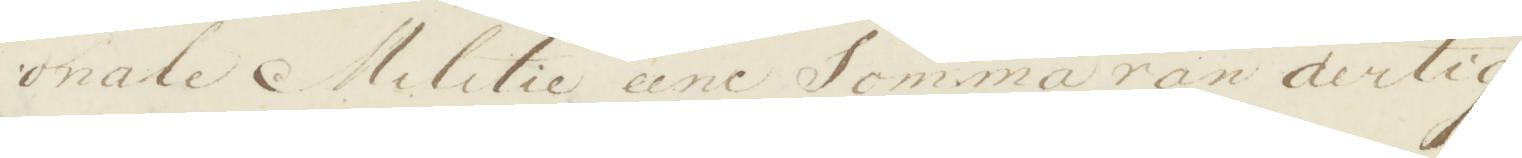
onale Militie eene somma van dertig
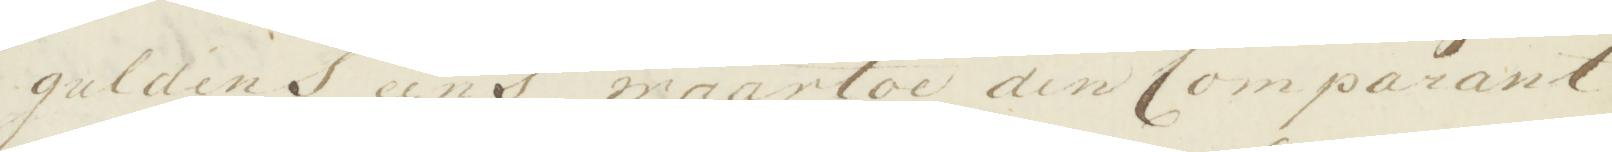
guldens eens waartoe den Comparant
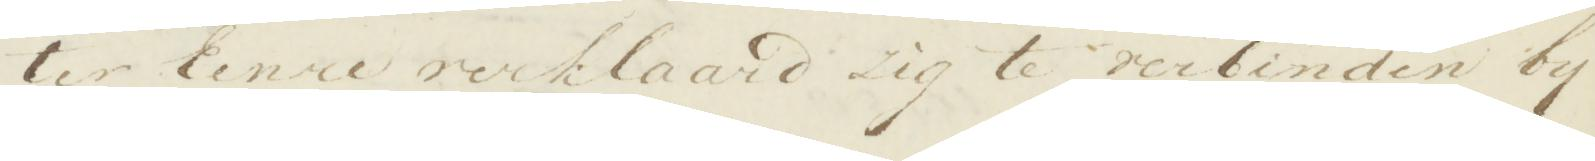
ter Eenre verklaard zig te verbinden by
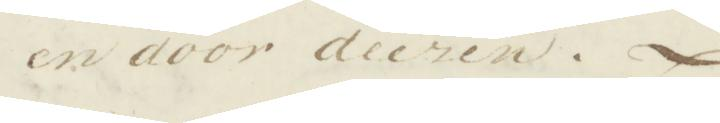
en door deezen.
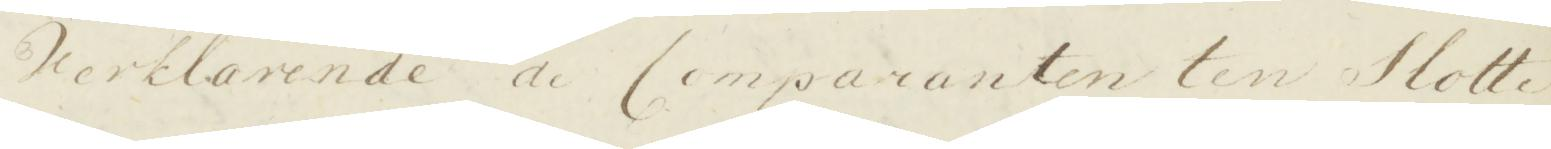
Verklarende de Comparanten ten slotte
